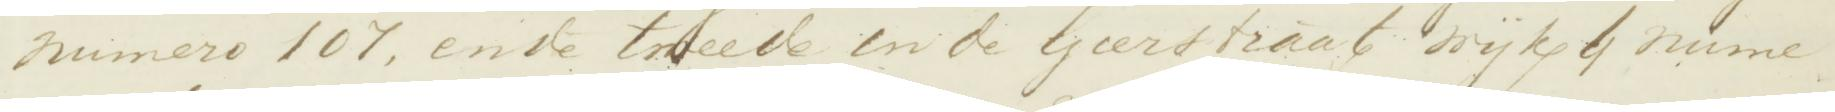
numero 107, en de tweede in de Geerstraat wijk 4 nume
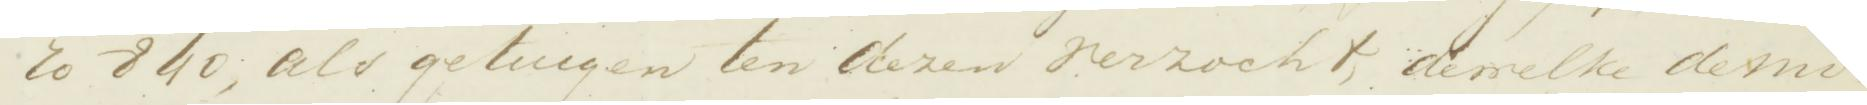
ro 840; als getuigen ten dezen verzocht dewelke de mi
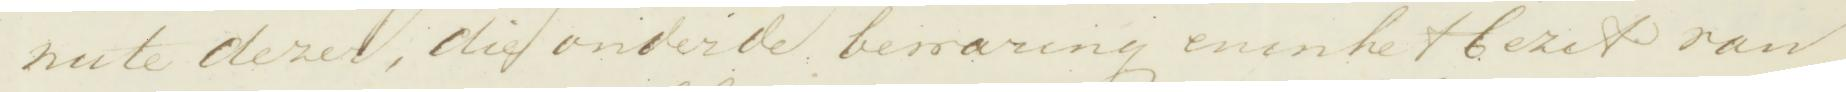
nute dezer, die onder de bewaring en in het bezit van
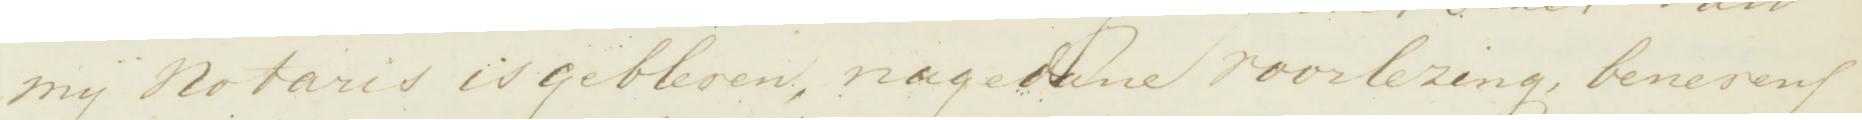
mij Notaris is gebleven, na gedane voorlezing, benevens
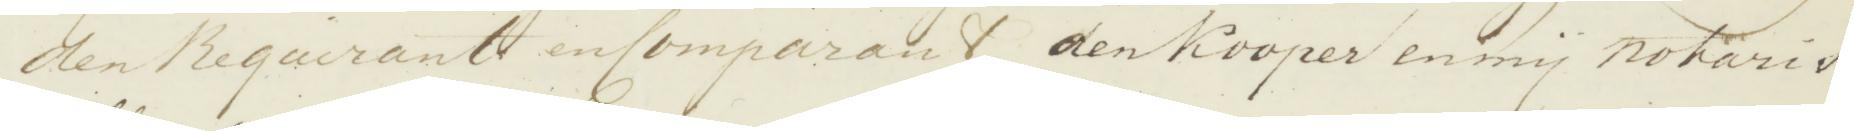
den Requirant en Comparant, den kooper en mij notaris
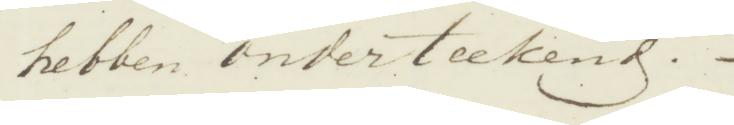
hebben onder teekend.
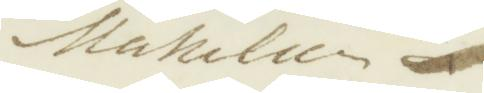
Makelaar
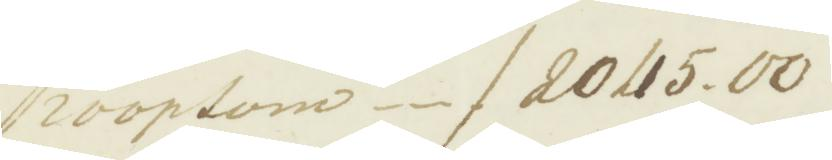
Koopsom _ _ ƒ 2045.00
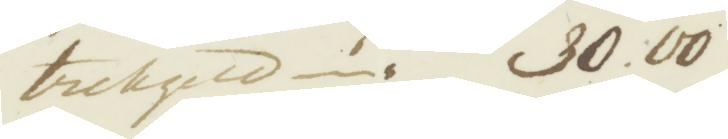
trekgeld _ „ 30:00
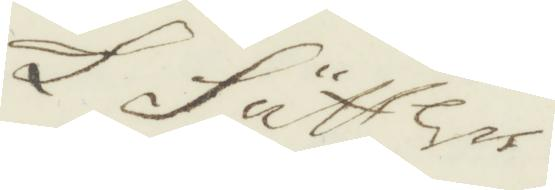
S Sütters
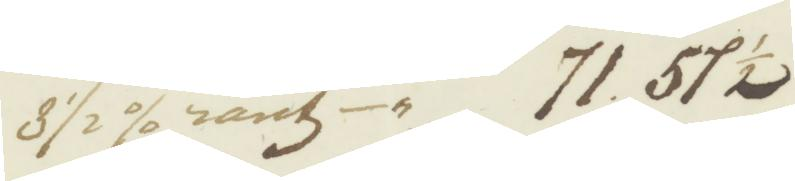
3½% rant — „ 71.57½
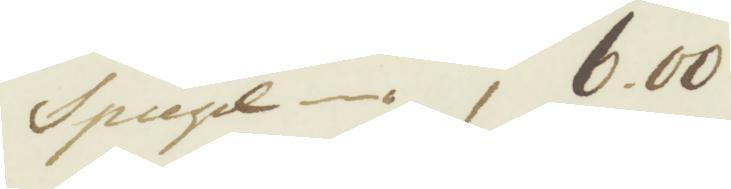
spiegel — „ 6.00
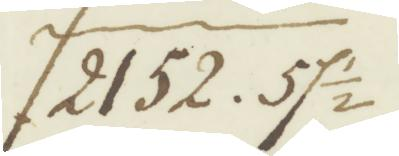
ƒ2152. 57½
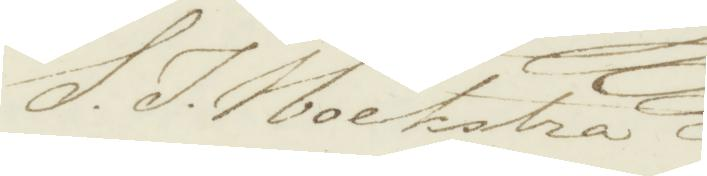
S. J. Hoekstra
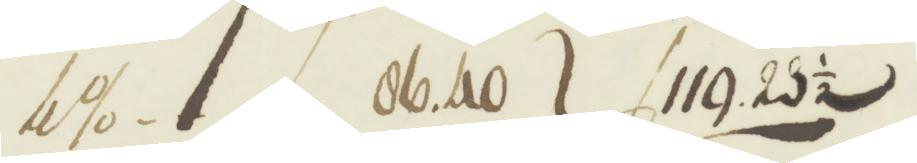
4% ƒ 86.40 ƒ119.23½
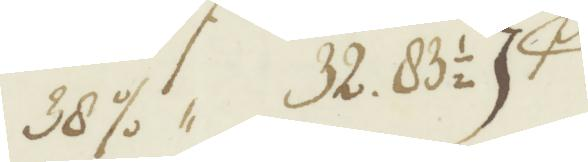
38% „ 32.83½
